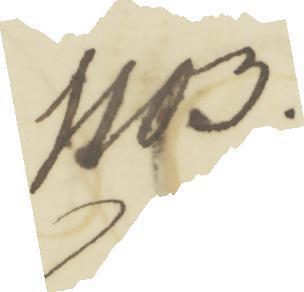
1103
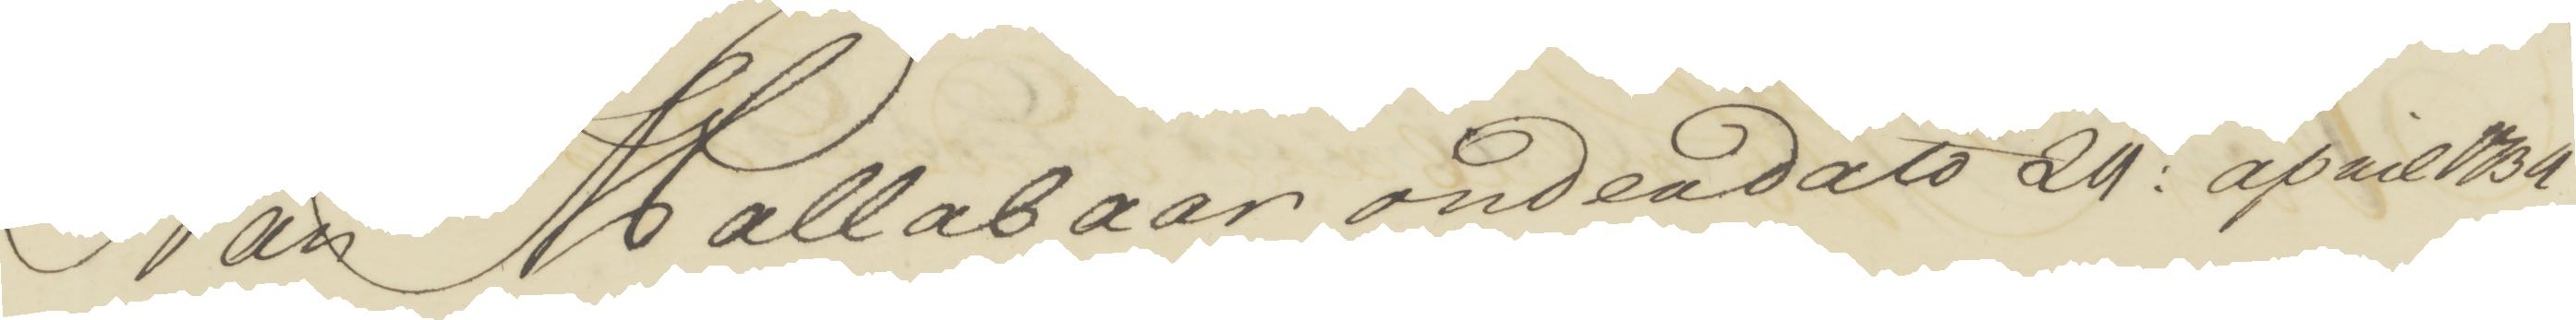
Van Mallabaar onder dato 24:' april 1734
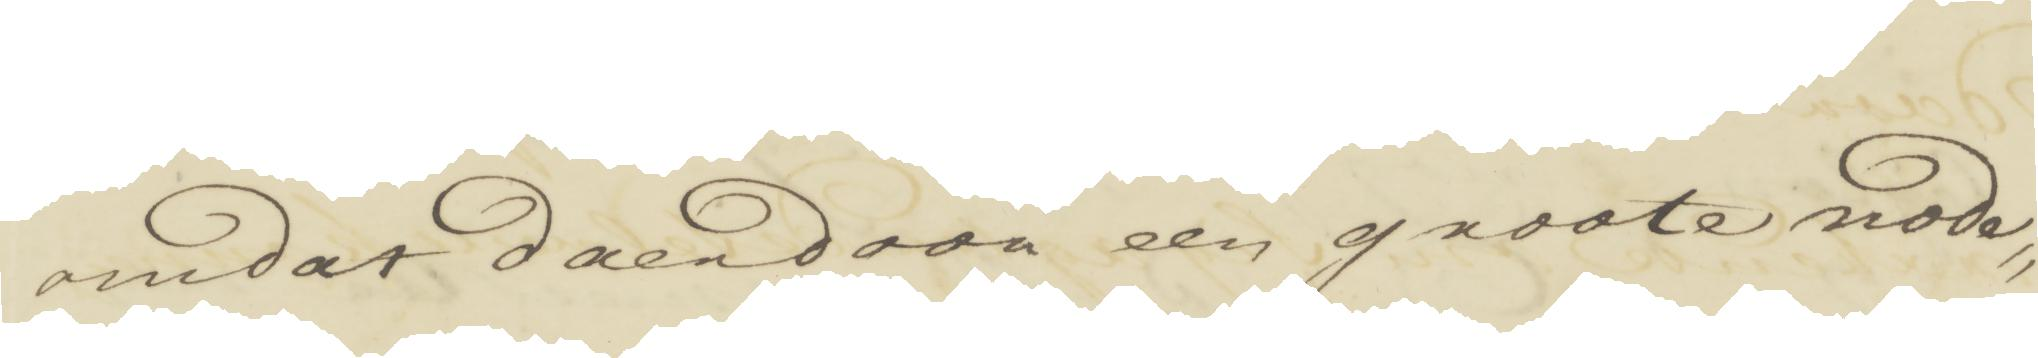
om dat daer door een groote node„
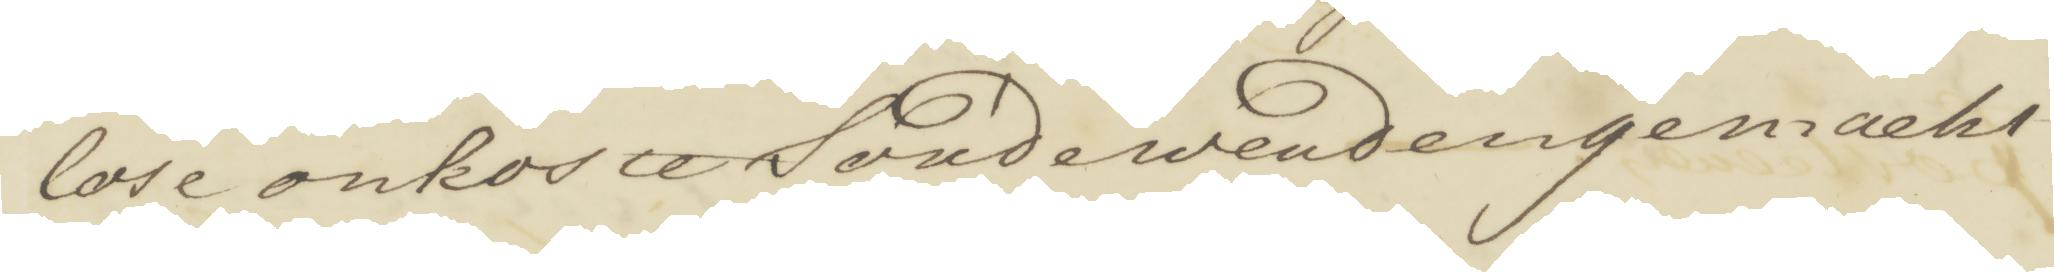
lose onkoste soude werden gemaekt
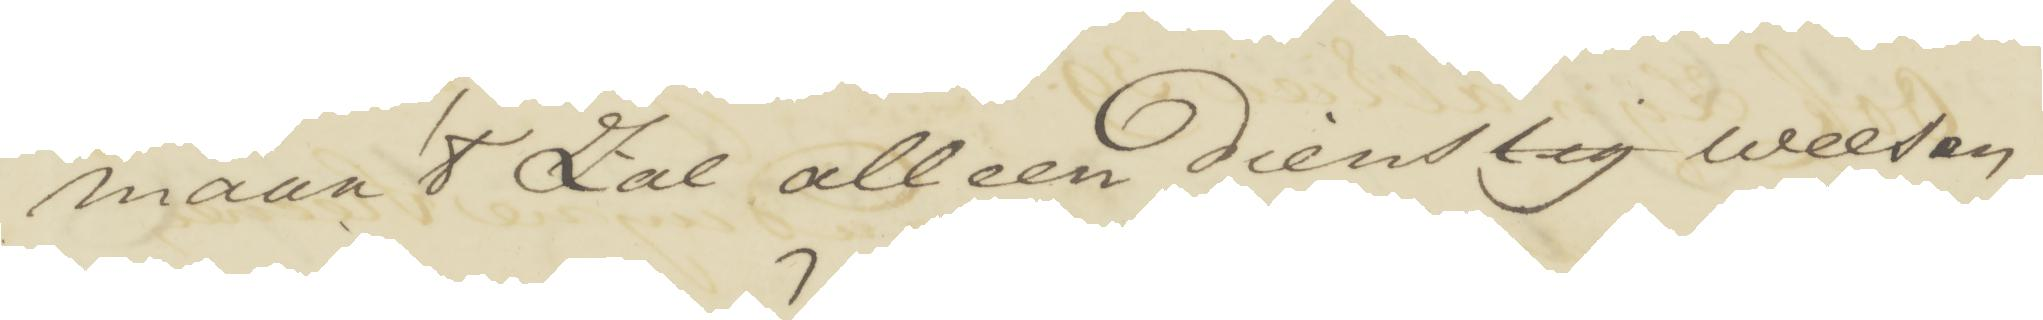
maar 't zal alleen dienstig weesen
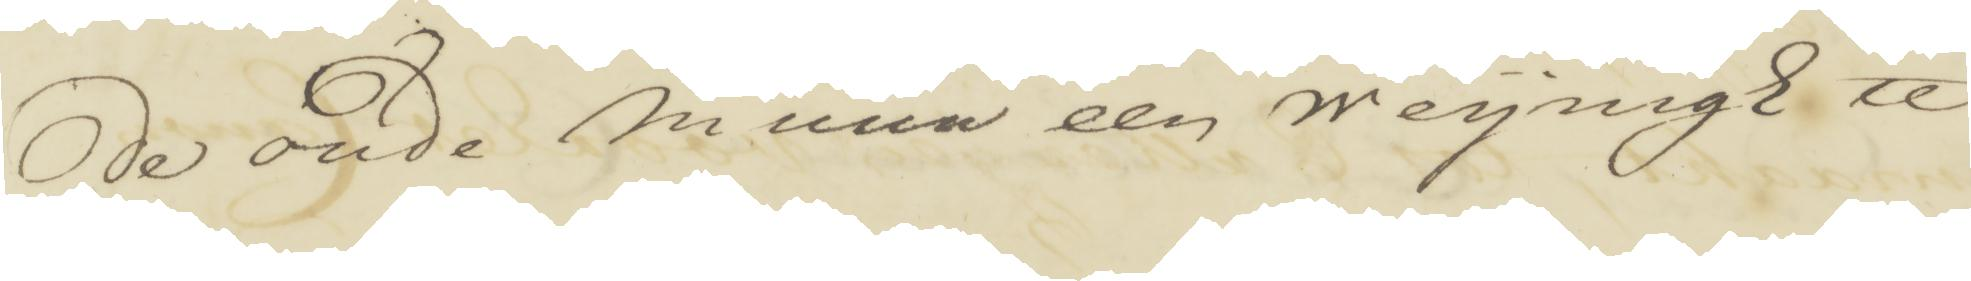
de oude muur een weijnigh te
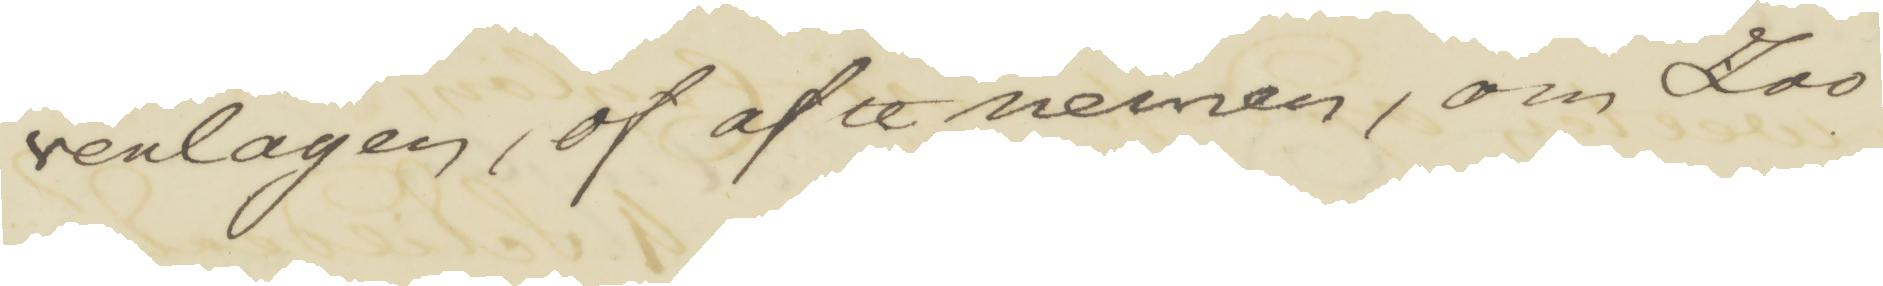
verlagen, of af te nemen, om zoo
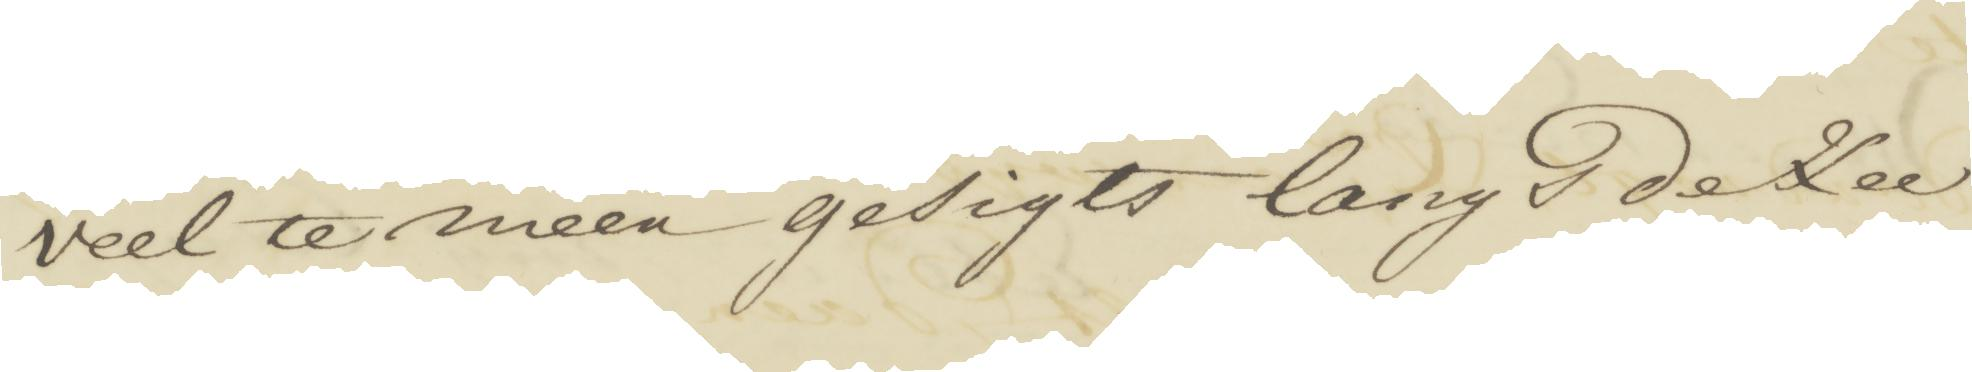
veel te meer gesigts langs de zee
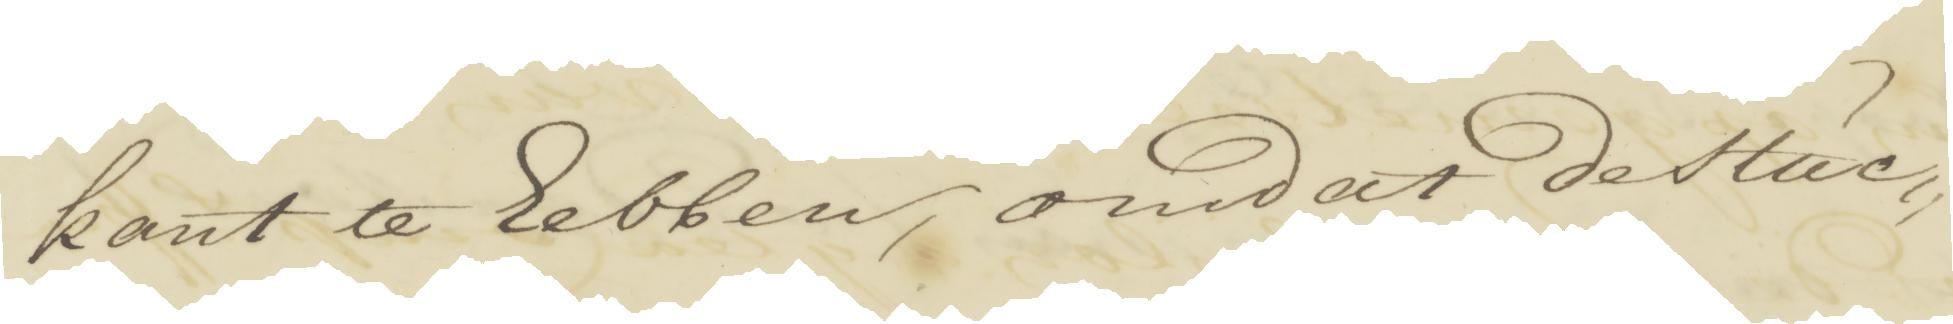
kant te hebben, om dat de stuc„
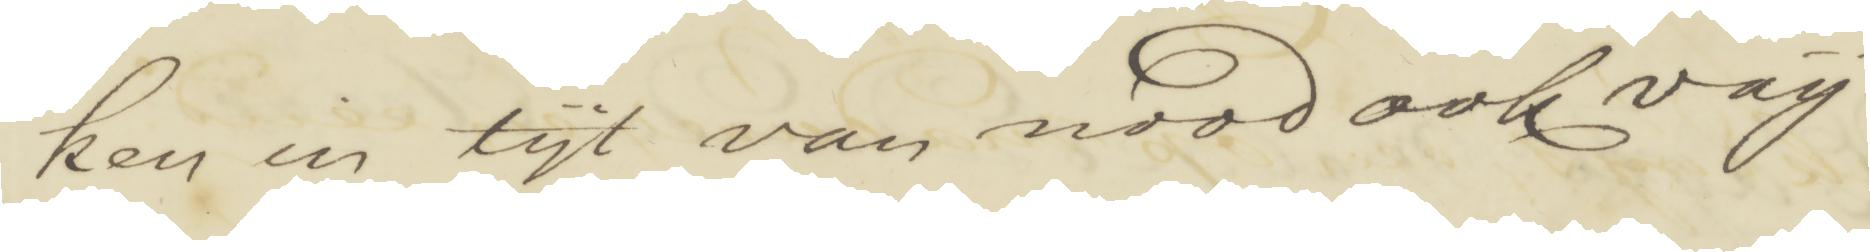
ken in tijt van nood ook vrij
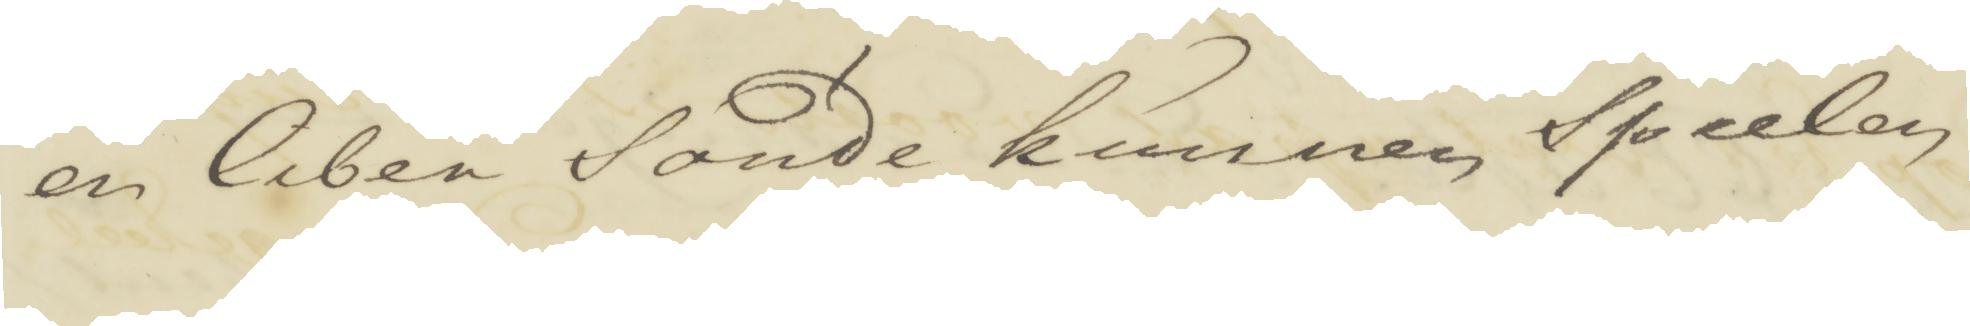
en liber soude kunnen speelen
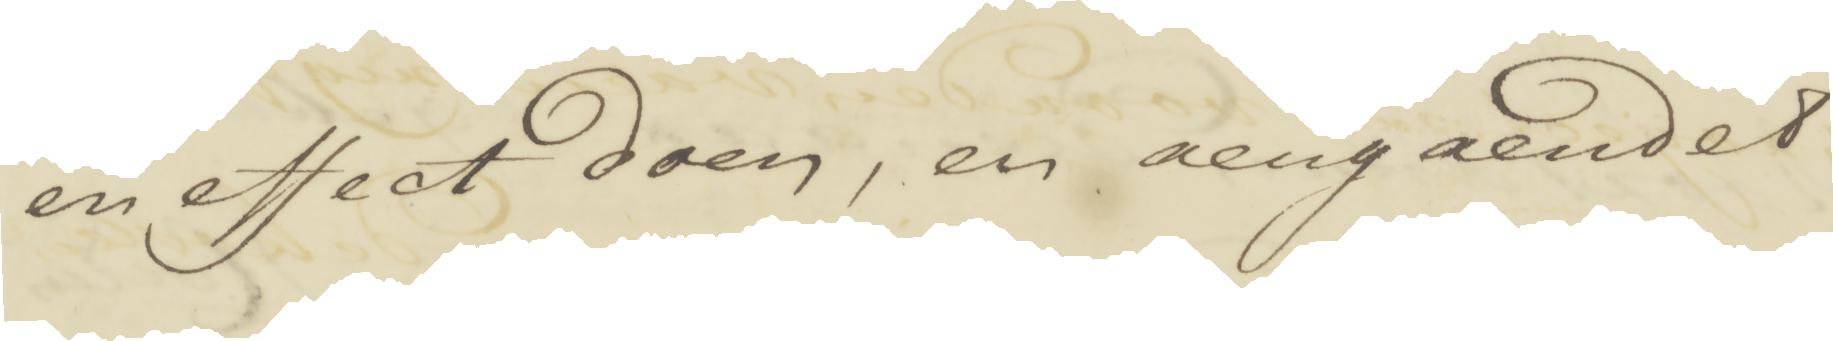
en effect doen, en aengaende 't
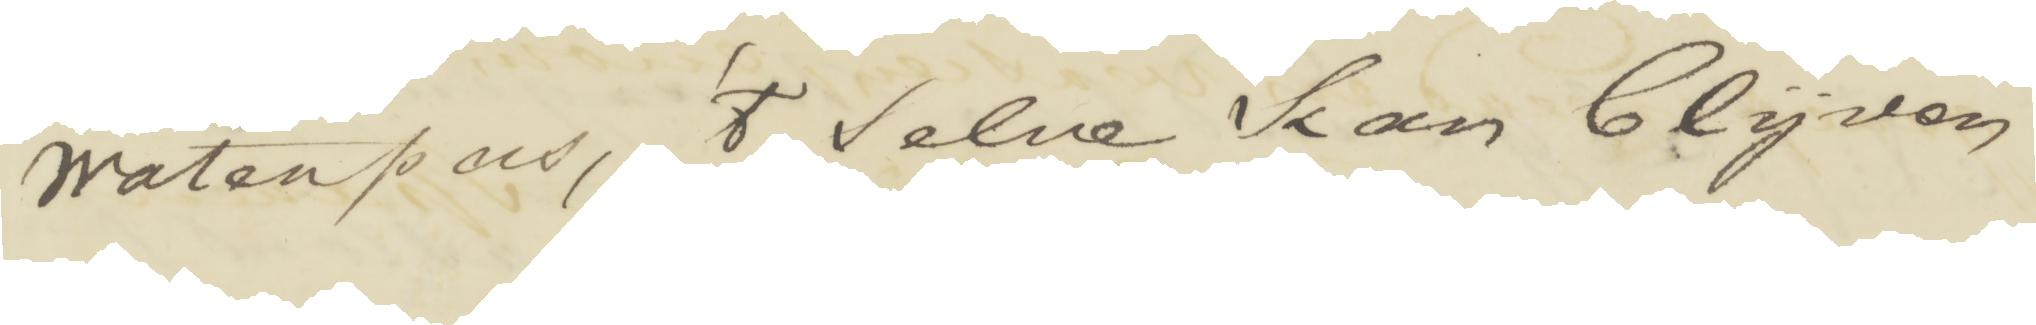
waterpas, ’t selve kan blijven
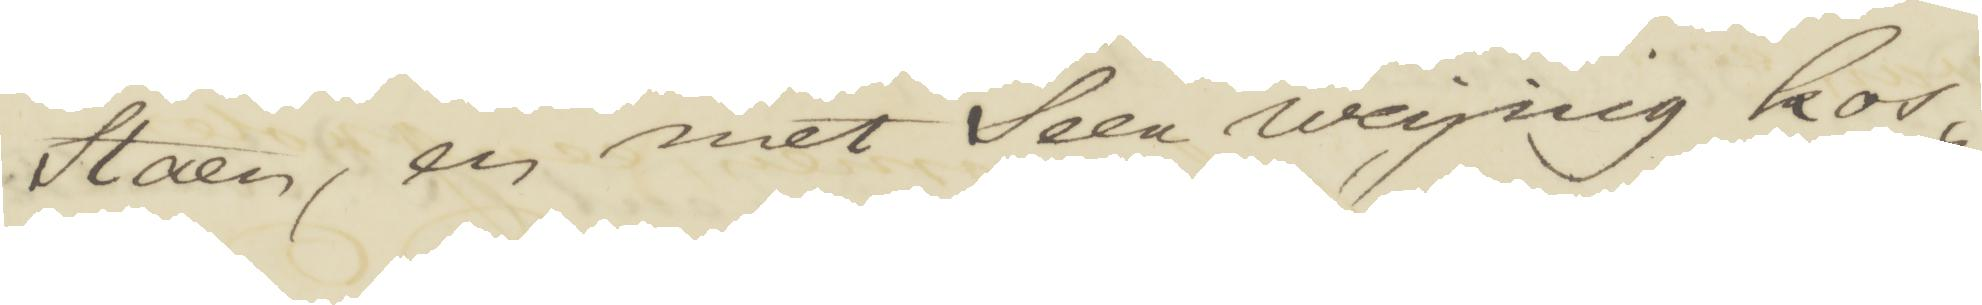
staen, en met seer weijnig kos„
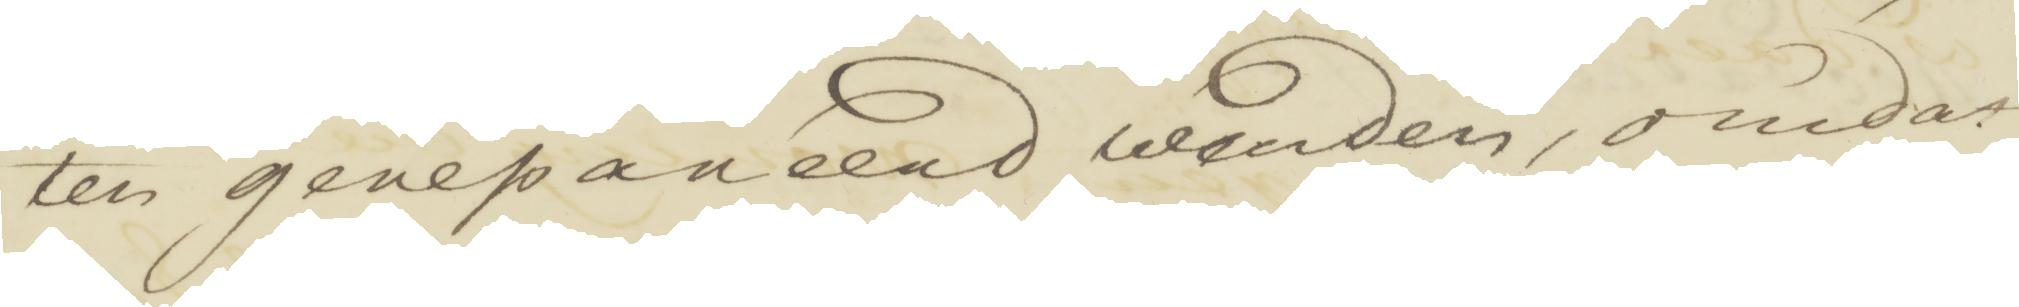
ten gerepareerd werden, om dat
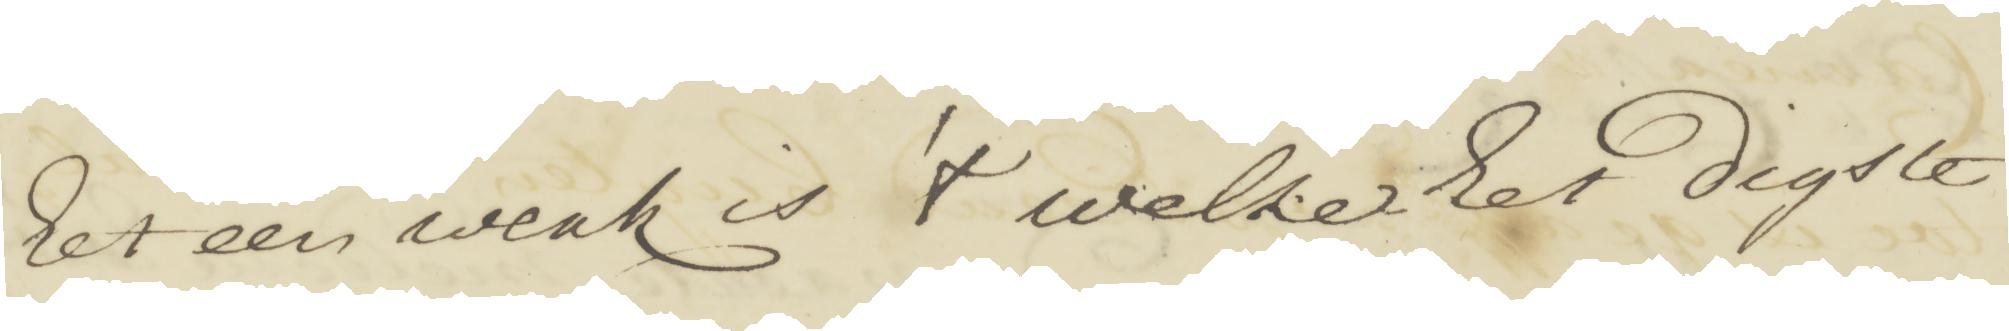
het een werk is ’t welke het digste
